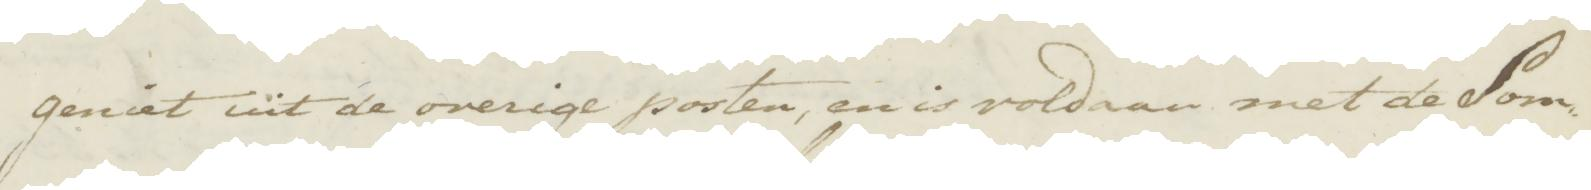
geniet uit de overige posten, en is voldaan met de Som„
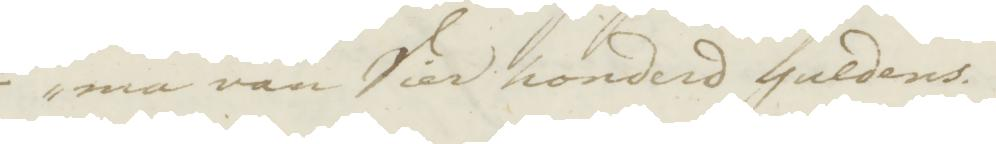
„ma van Vier honderd Guldens.
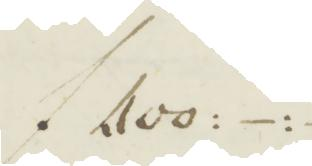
ƒ 400: —:
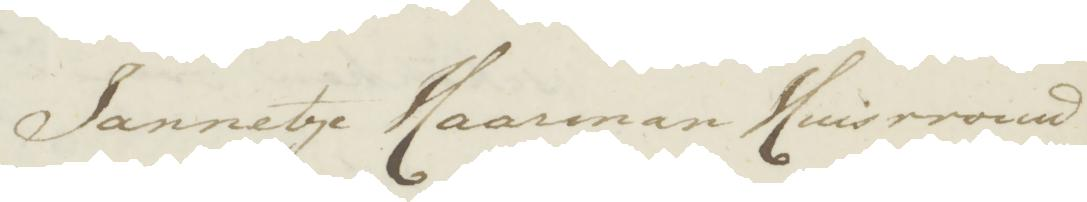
Jannetje Haarman Huisvrouw
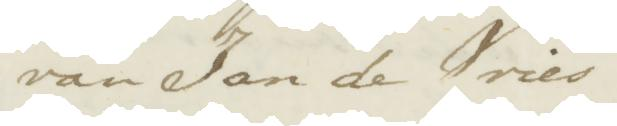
van Ian de Vries
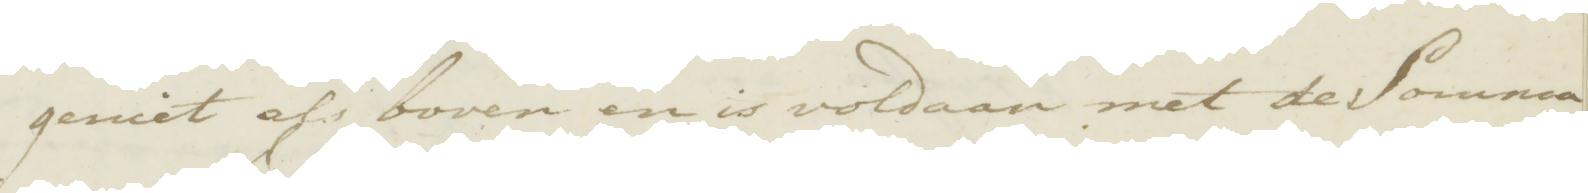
geniet als boven en is voldaan met de Somma
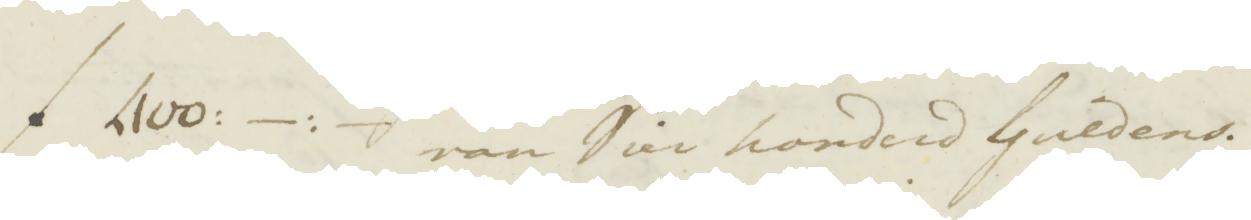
ƒ 400: —: — van Vier honderd Guldens.
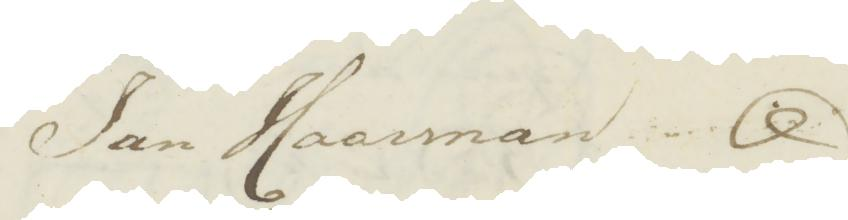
Jan Haarman
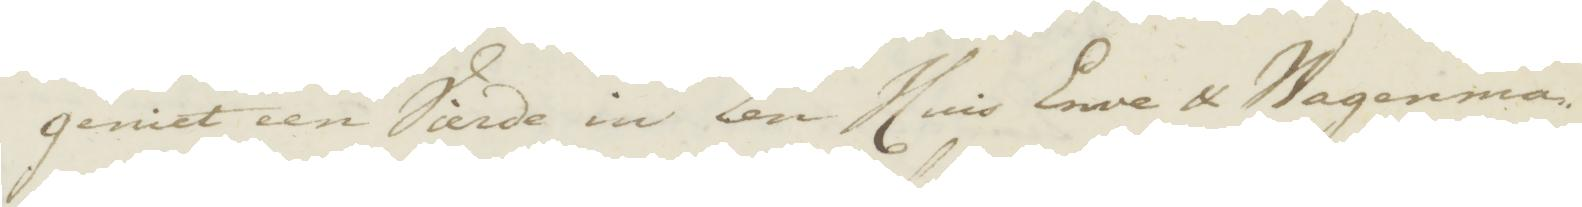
geniet een Vierde in Een Huis Erve & Wagenma„
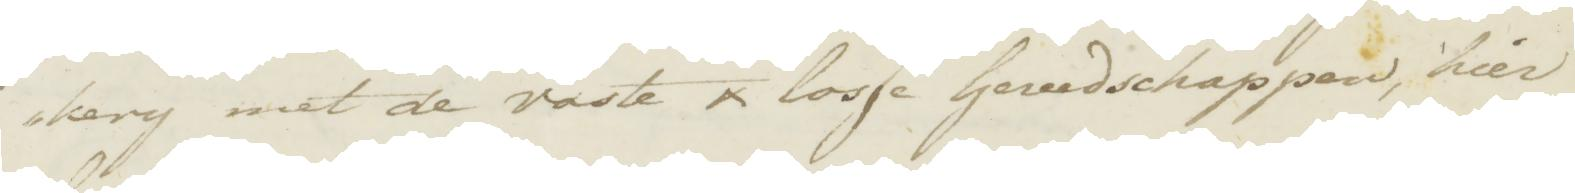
„kery met de vaste & losse Gereedschappen, hier
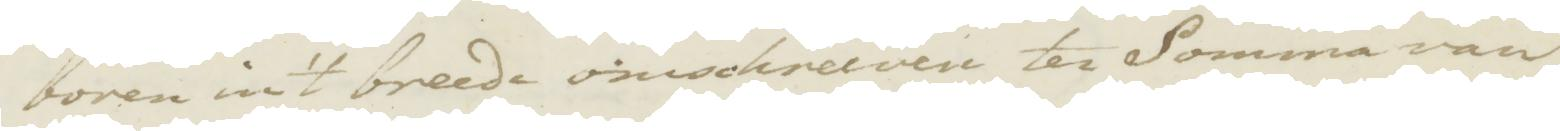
boven in ’t breede omschreeven ter Somma van
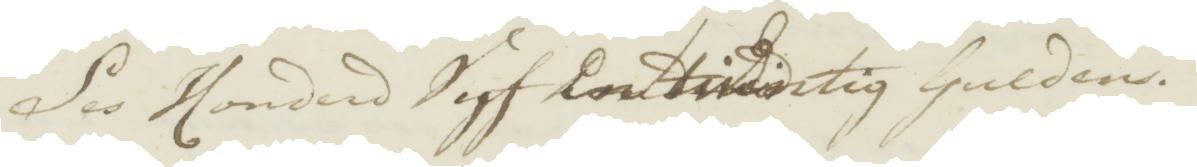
Ses Honderd Vyf En twintig Guldens.
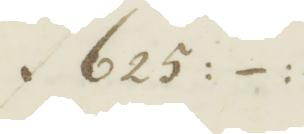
ƒ 625: — :
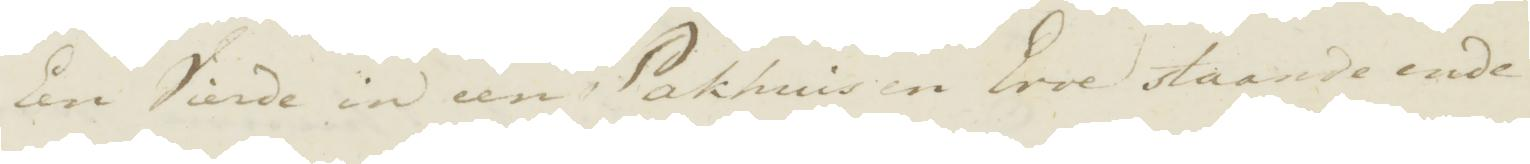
Een Vierde in een Pakhuis en Erve staande ende
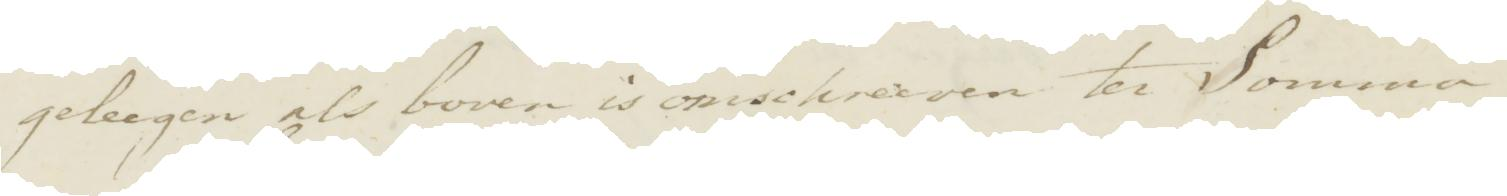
geleegen als boven is omschreeven ter Somma
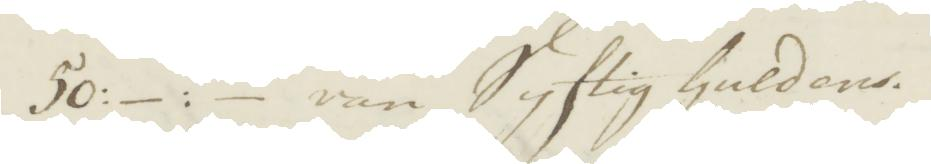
50: —: — van Vyftig Guldens.
